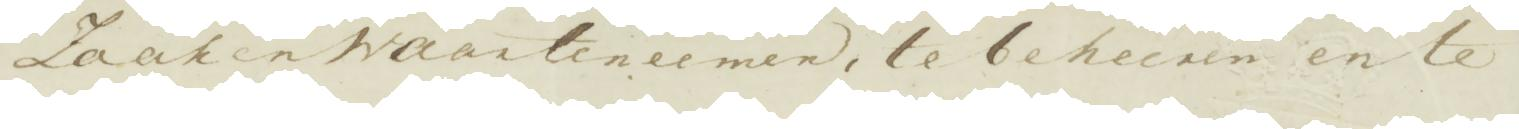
Zaaken waar te neemen, te beheeren en te
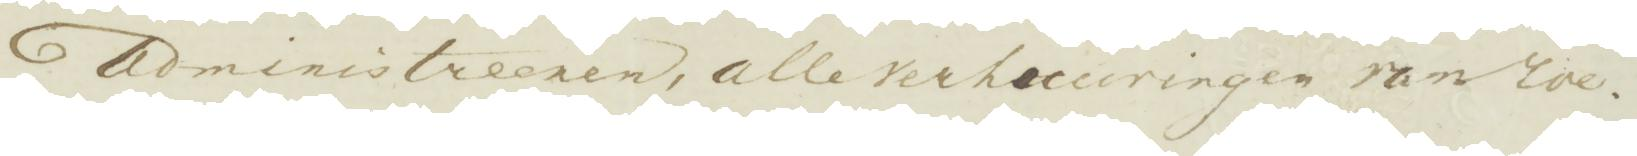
Administreeren, alle verhuuringen van roe
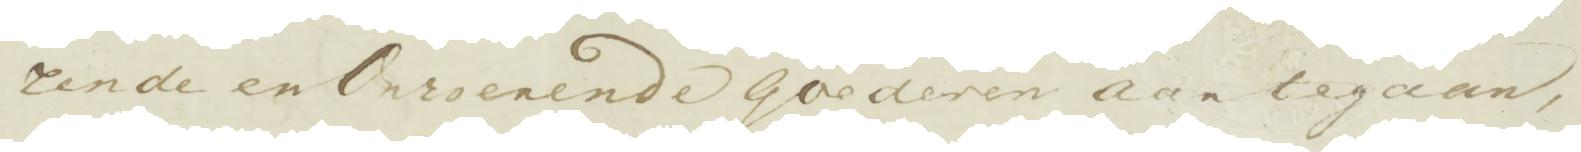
rende en Onroerende goederen aan te gaan,
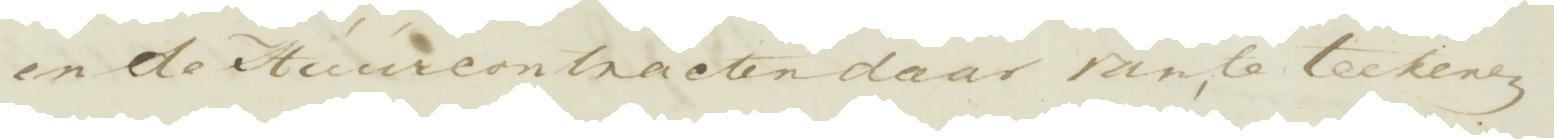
en de Huurcontracten daar van, te teekenen,
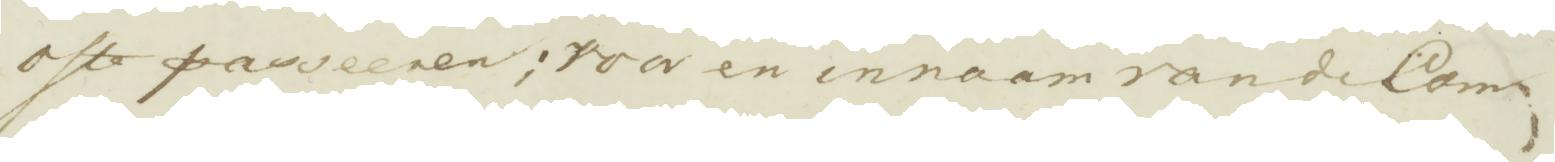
ofte passeeren; voor en innaam van de Com„
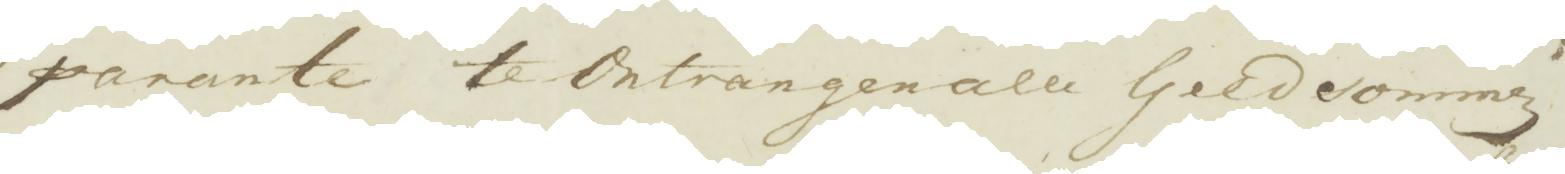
parante te ontvangen alle Geldsommen
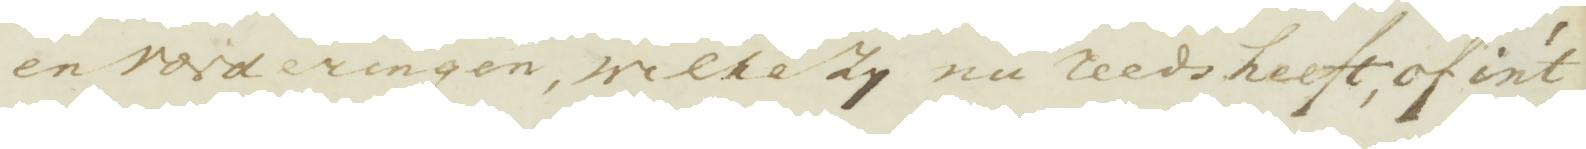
en vorderingen, welke zy nu reeds heeft, of in ’t
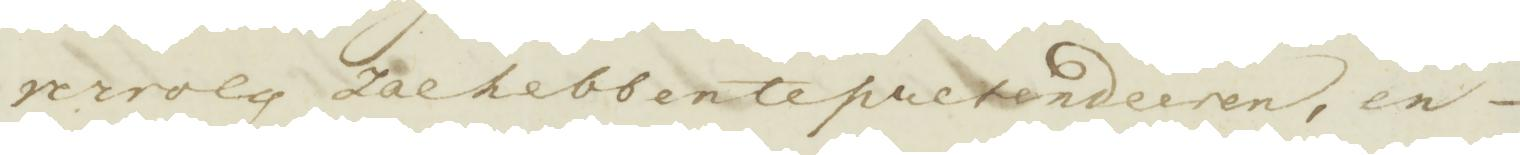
vervolg zal hebben te pretendeeren, en -
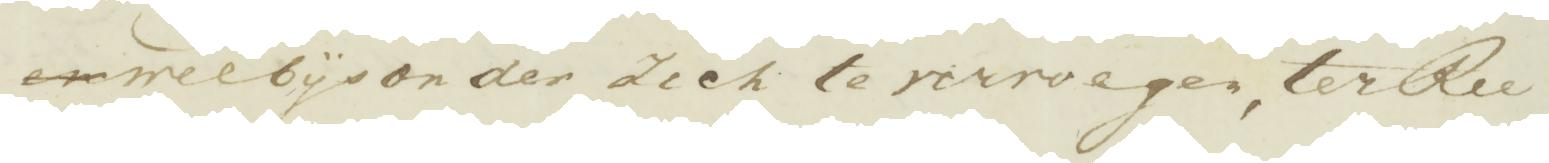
en welbijsonder zich te vervoegen, ter Ree
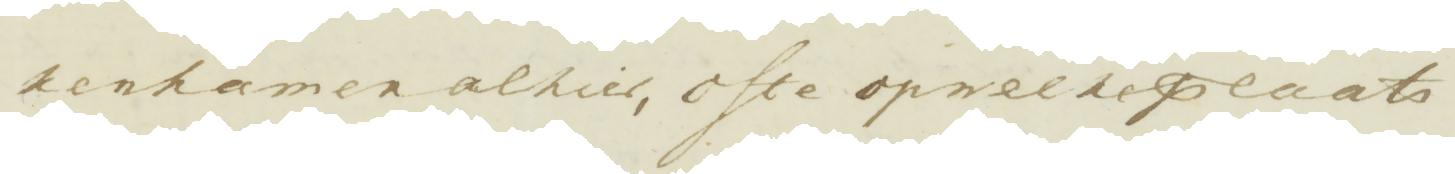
kenkamer alhier, ofte op welke plaats
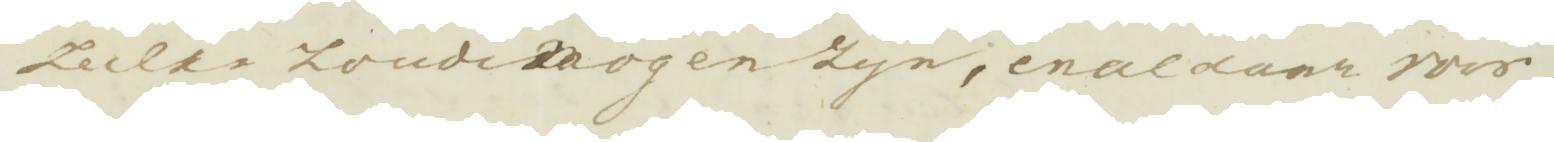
zulks zoude mogen zyn, en aldaar voor
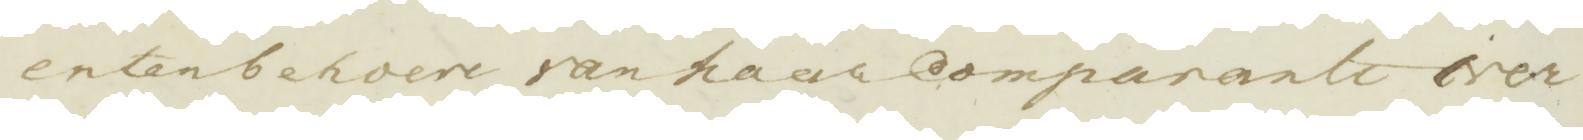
en ten behoeve van haar companante over
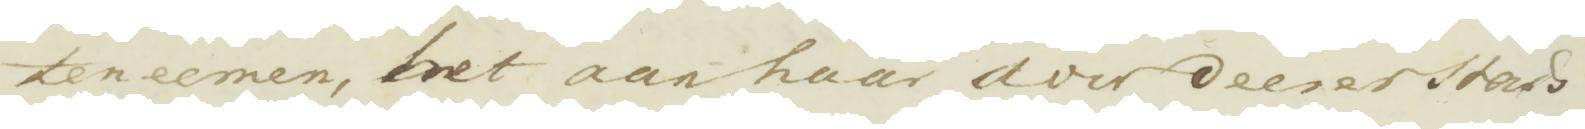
teneemen, het aan haar door deeser stad
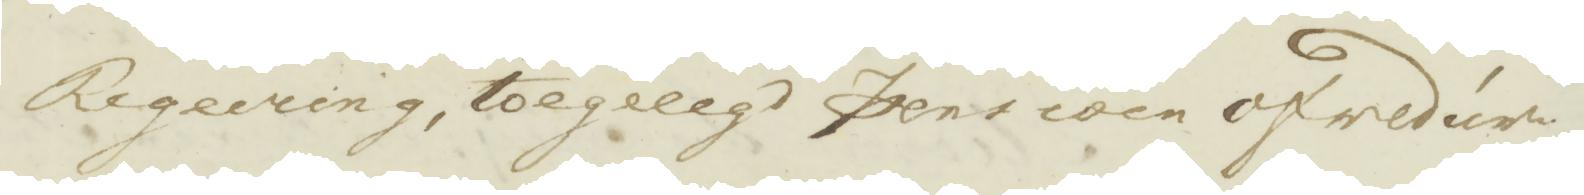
Regeering, toegelegd Pensioen of weduw
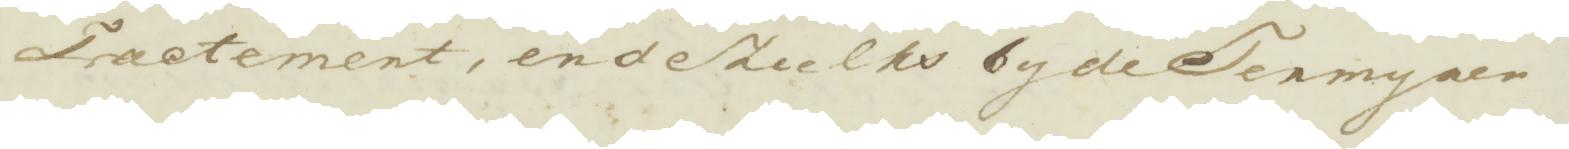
Tractement, en de zulks by de Termynen
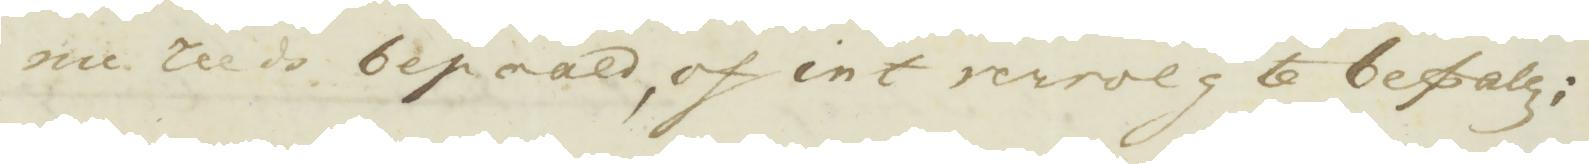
nu reed bepaald, of in ’t vervolg ’t bepalen;
